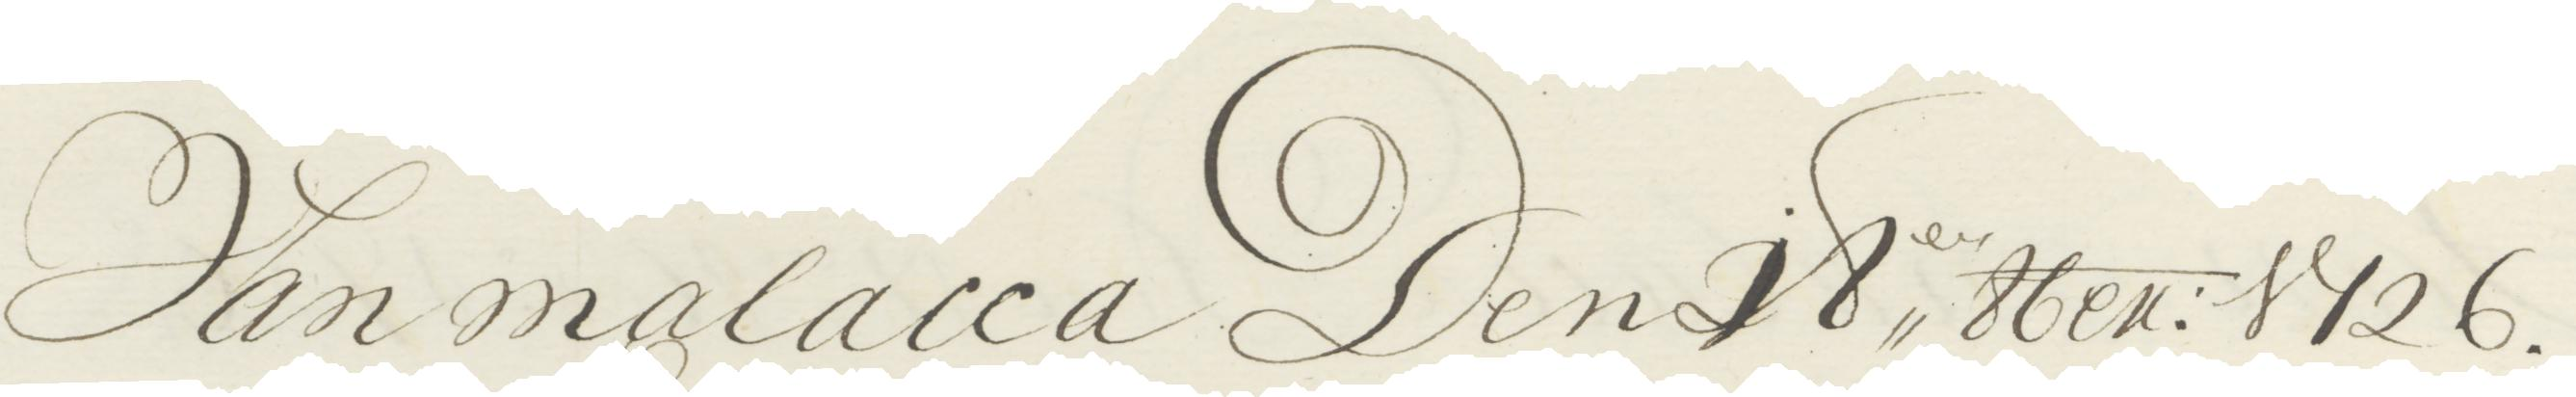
Van malacca Den 18„en 8ber: 1726.
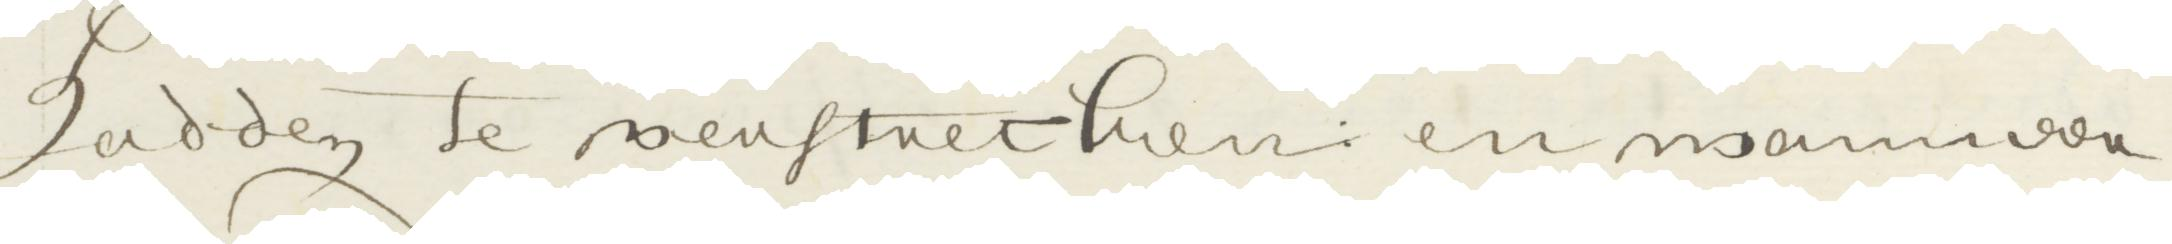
hadden te verstrecken: en wanneer
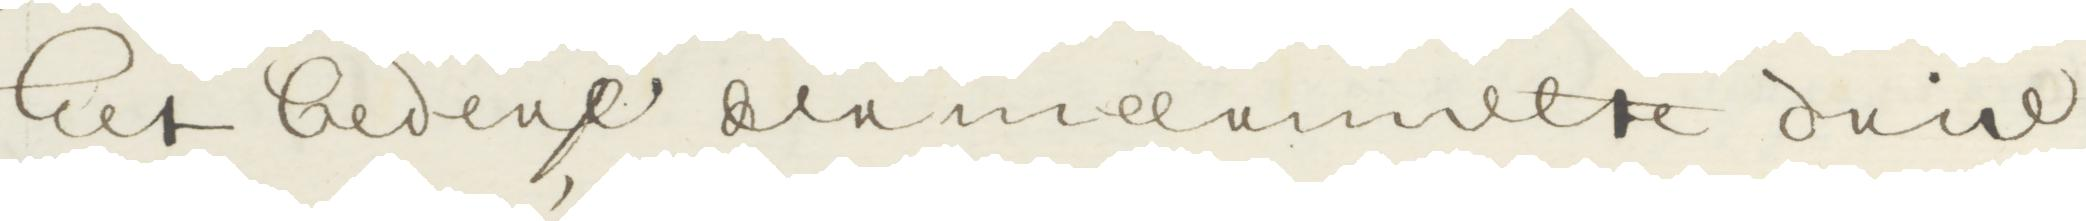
het bederf der meermelte drie
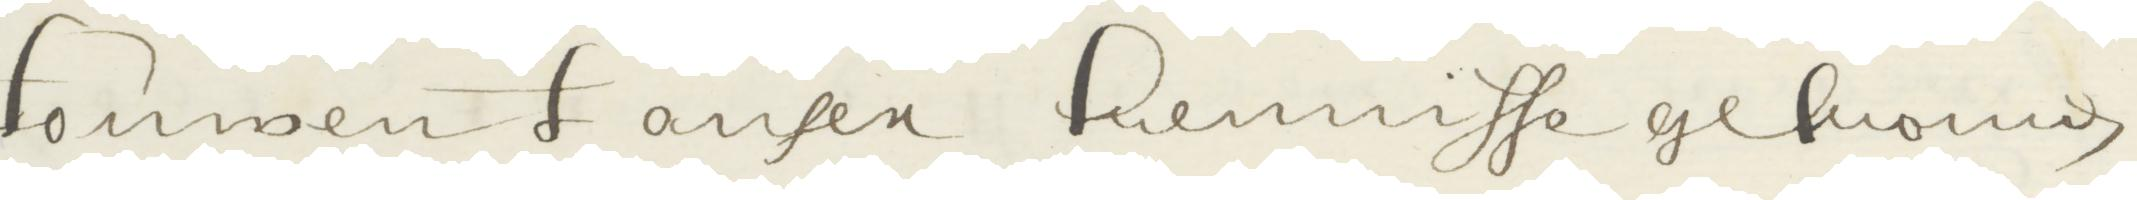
touwen 't onser kennisse gekomen
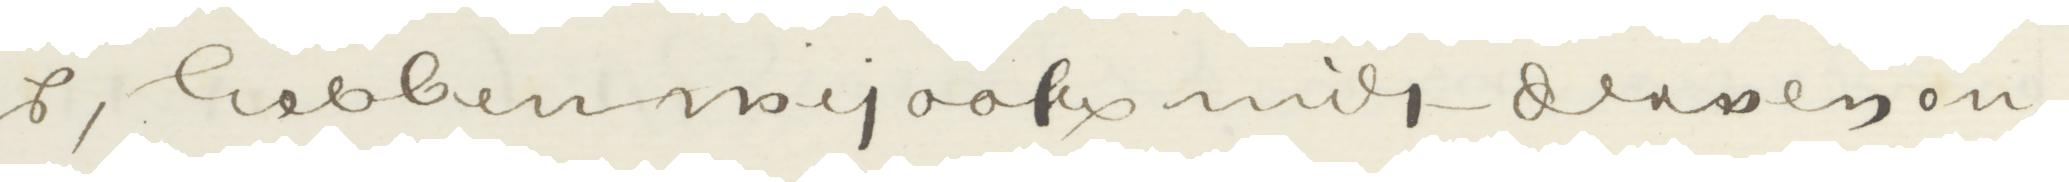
s, hebben wij ook niet derven on
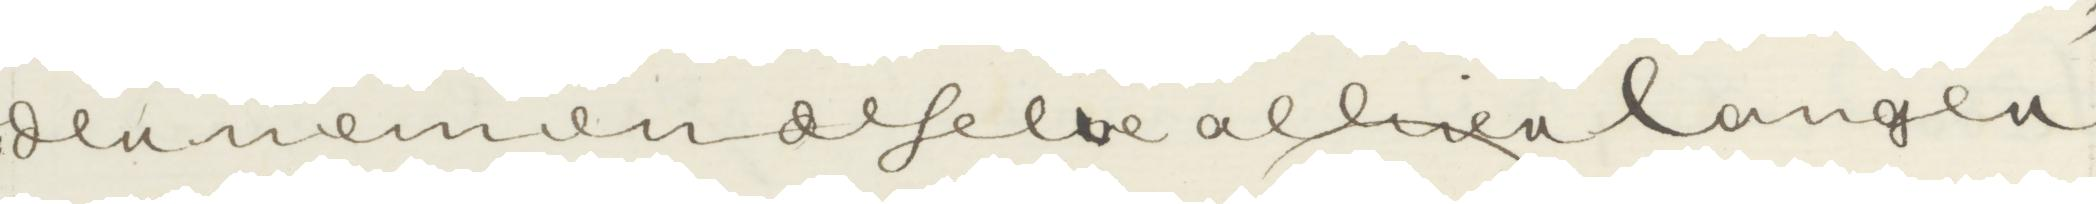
der nemen deselve alhier langer
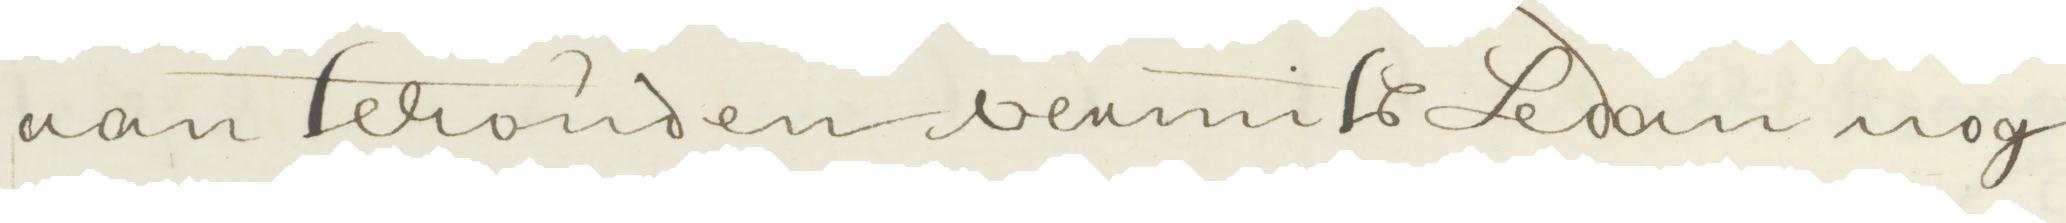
aan tehouden vermits se dan nog
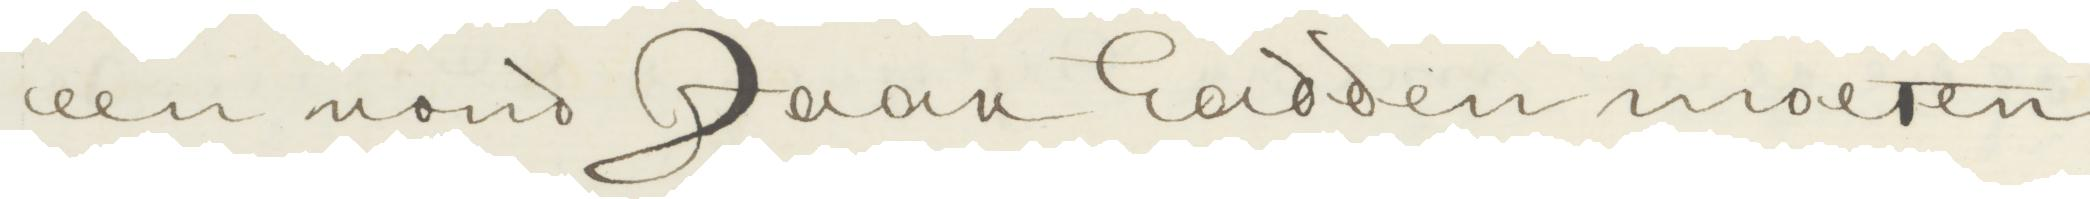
een rond daar hadden moeten
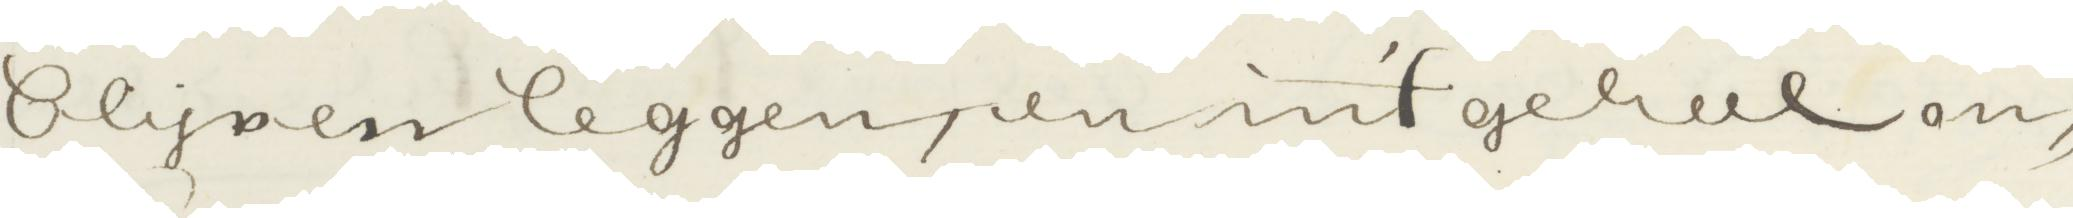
blijven leggen, en in't geheel on
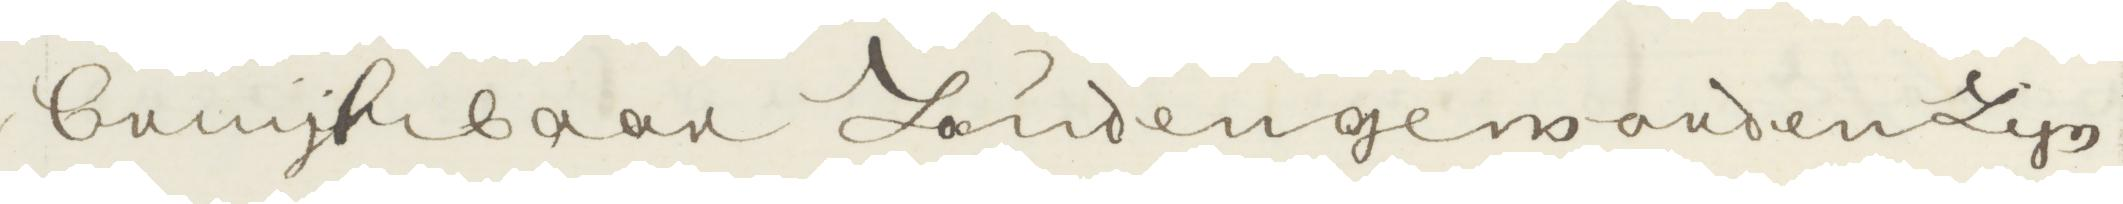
bruijkbaar zouden geworden zijn
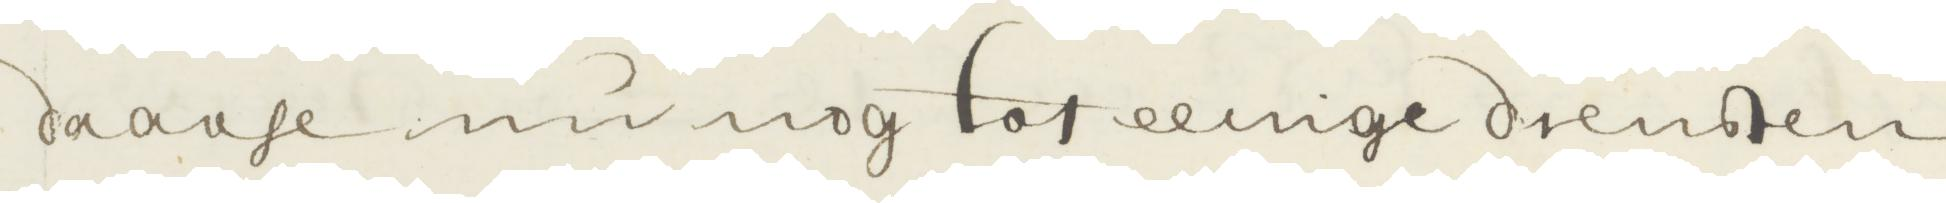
daarse nu nog tot eenige diensten
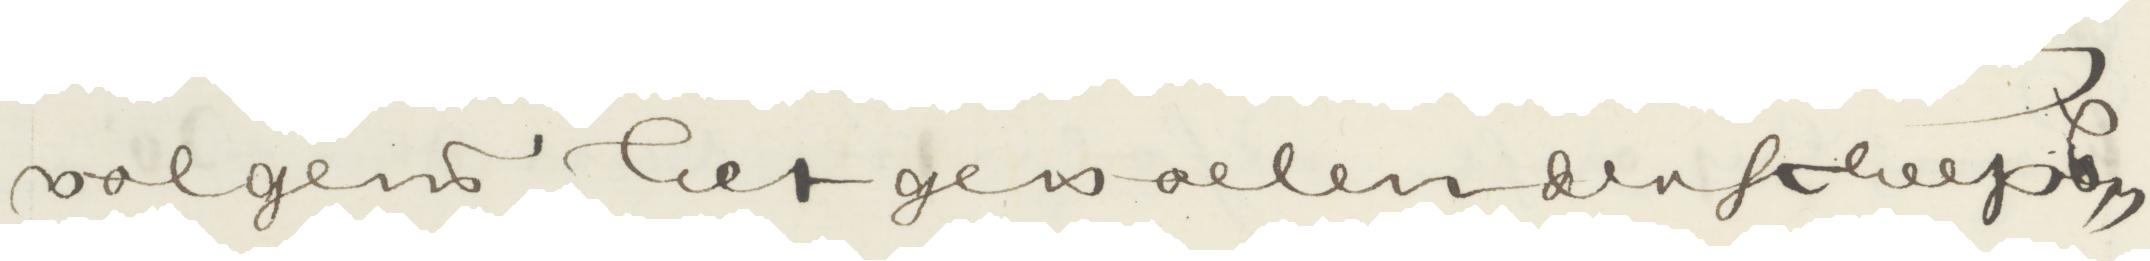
volgens het gevoelen der scheeps„
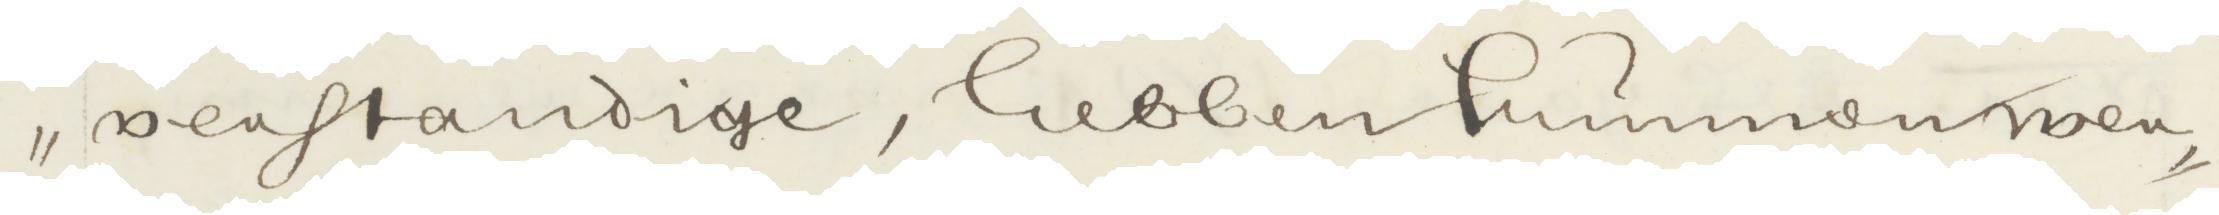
„verstandige, hebben kunnen wer„
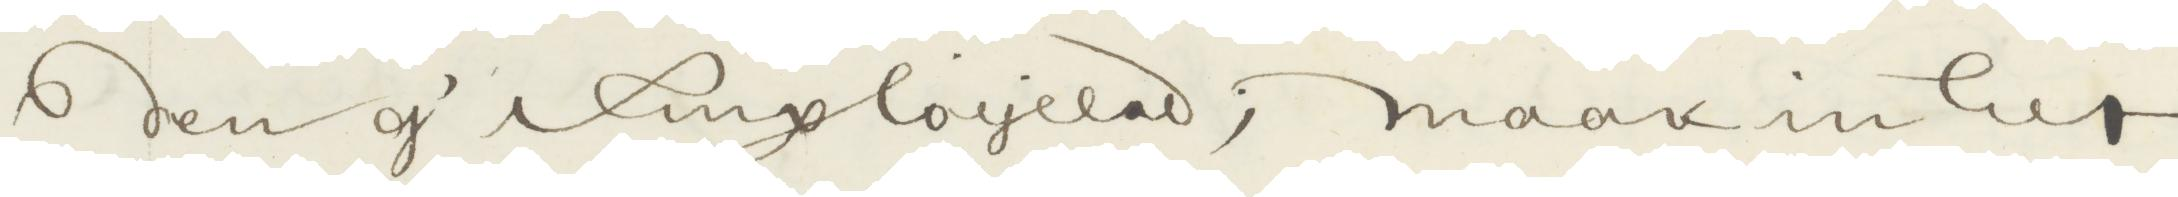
den g’ Emploijeerd, maar in het
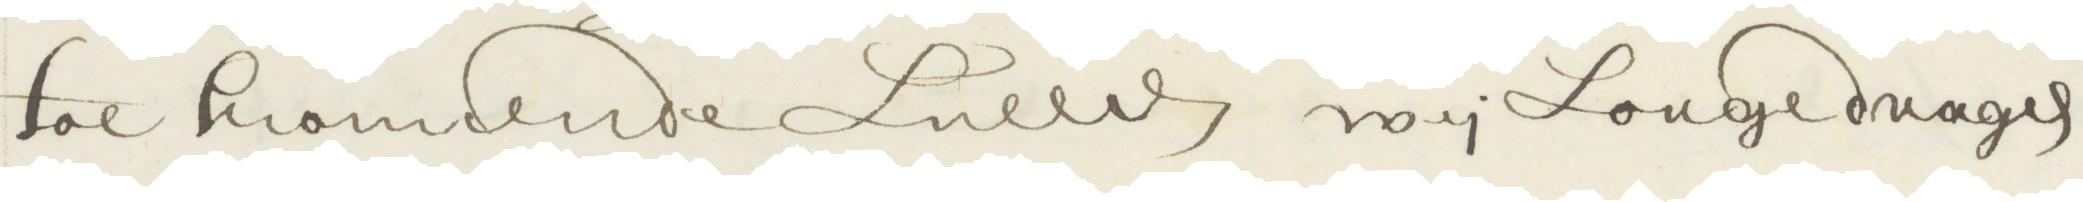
toe komende sullen wij sorge dragen
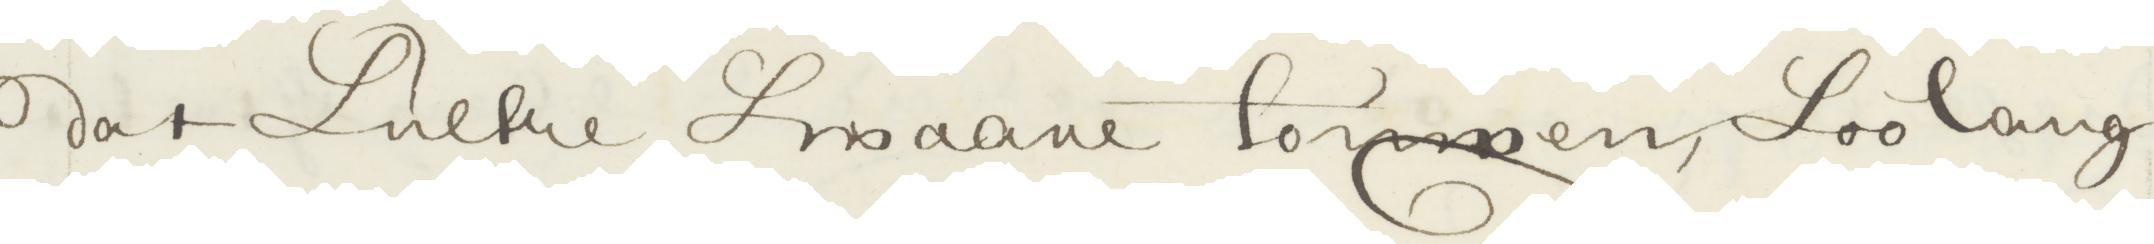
dat sulke swaare touwen, soo lang
